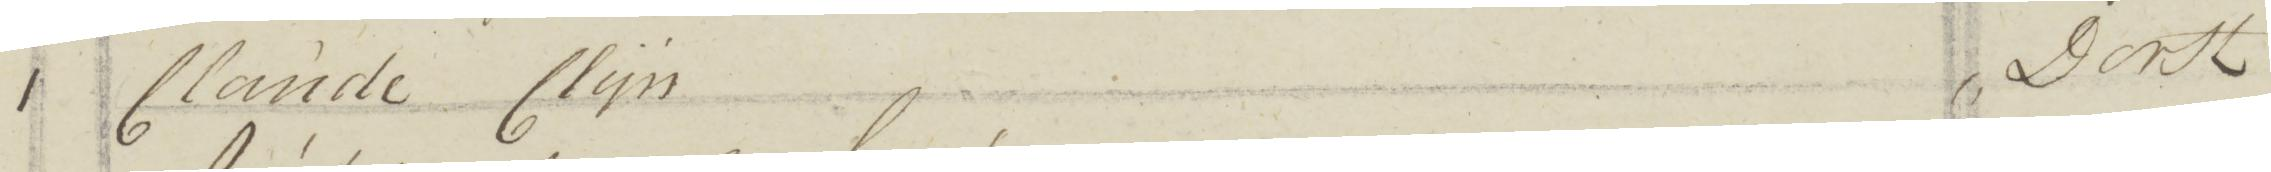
1 Claude Clijn „ Dorst
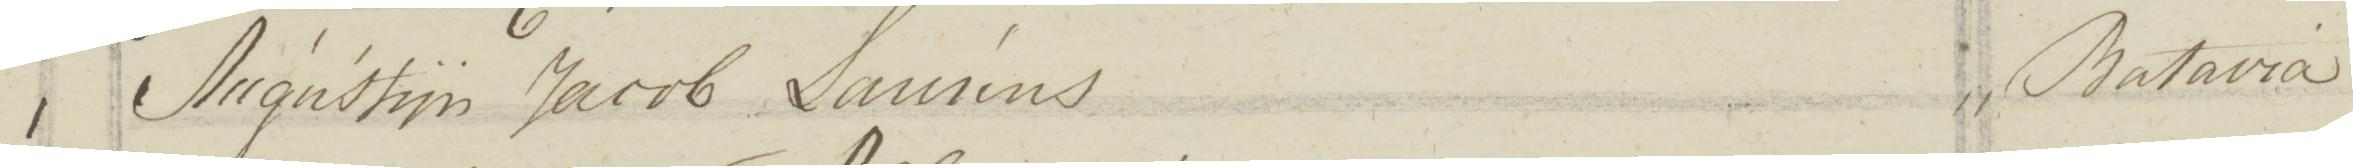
1 Augustijn Jacob Laurens „ Batavia
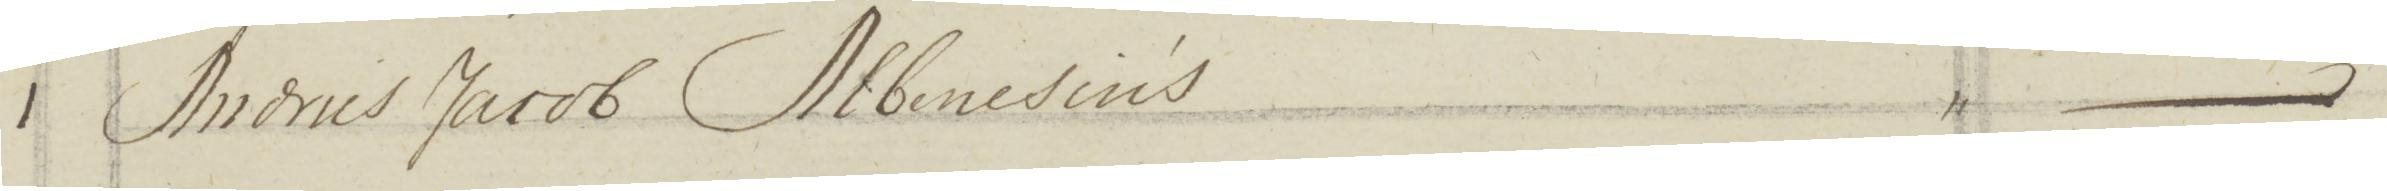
1 Andries Jacob Albenesius „ —'
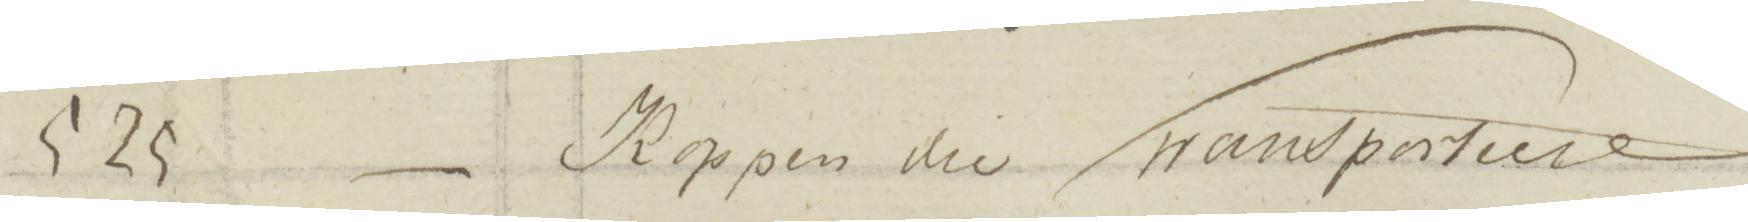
525 Koppen Koppen die Transporteere
